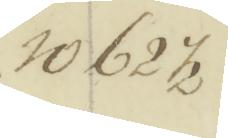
10„62½
